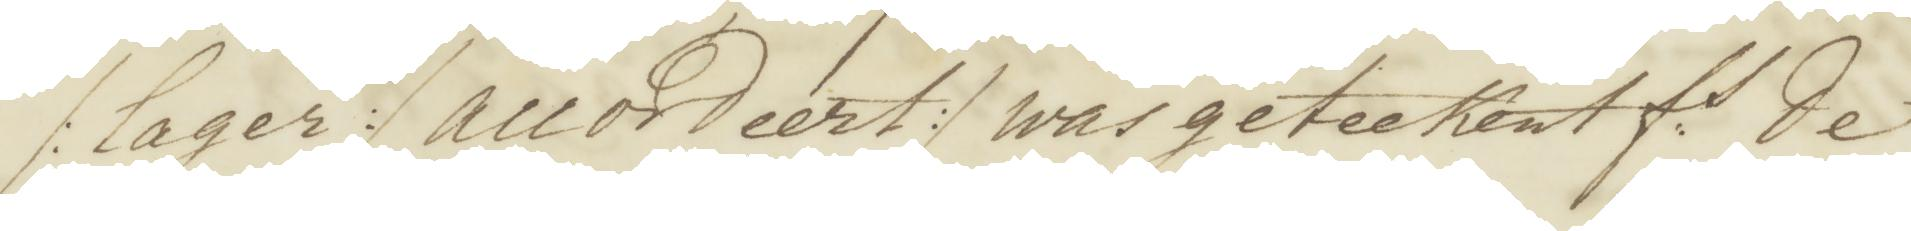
/: lager :/ accordeert :/ was geteekent f„s de
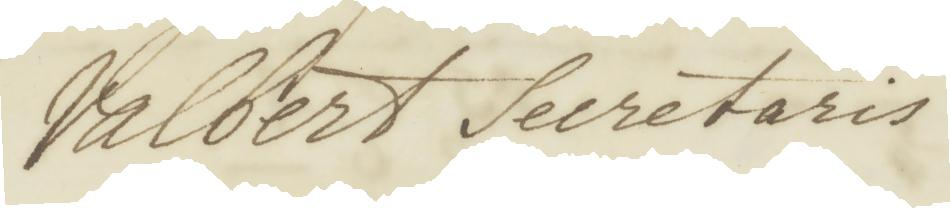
Valbert secretaris.
